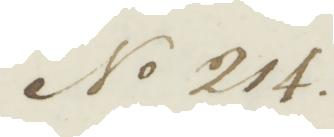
No 214.
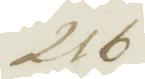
216.
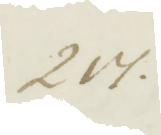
217.
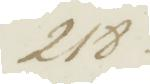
218.
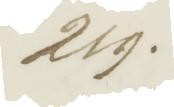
219.
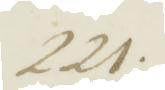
221.
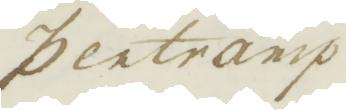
Per transp ƒ
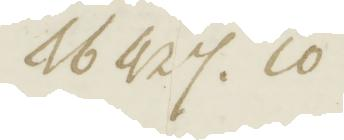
46427. 10 —
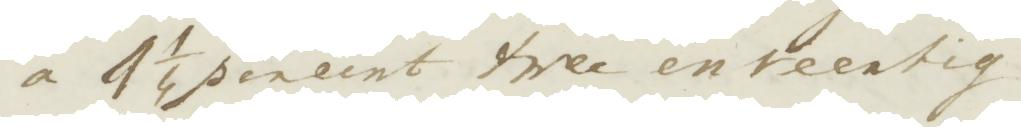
a 4 ¼ percent twee en veertig
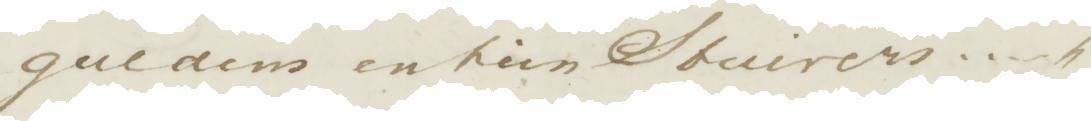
guldens en tien Stuivers - - - -
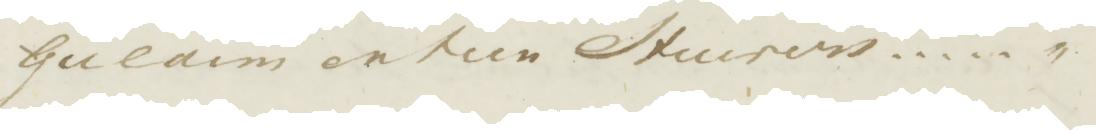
Guldens en tien Stuivers - - - - - „.
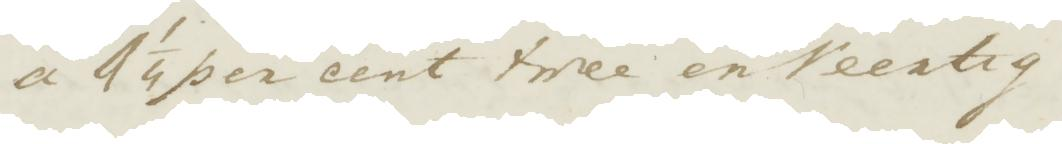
a 4¼ per cent twee en Veertig
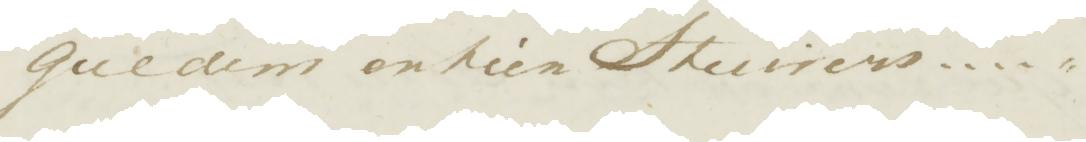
Guldens en tien Stuivers - - - - „
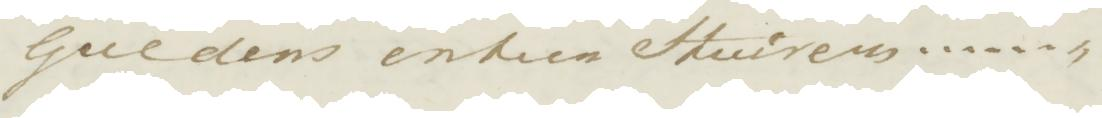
Guldens en tien Stuivers - - - - - - „
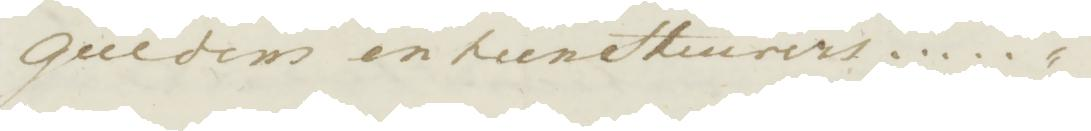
guldens en tien stuivers - - - - - „
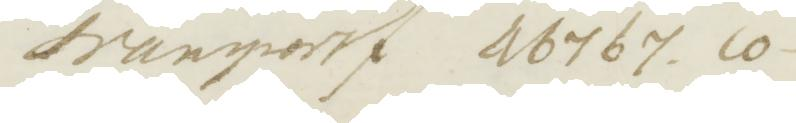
Transport ƒ 46767. 10 —
